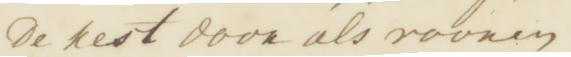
de rest door als vooren
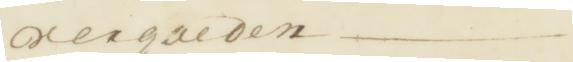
vergoeden —
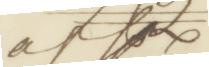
afsz
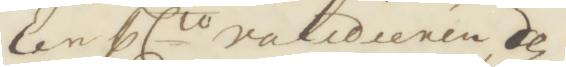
Een pC=to valideeren, de
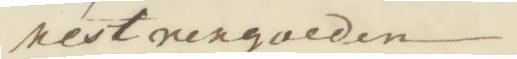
rest vergoeden
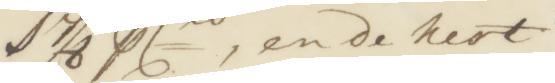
1 7/8 pC=to, en de rest
